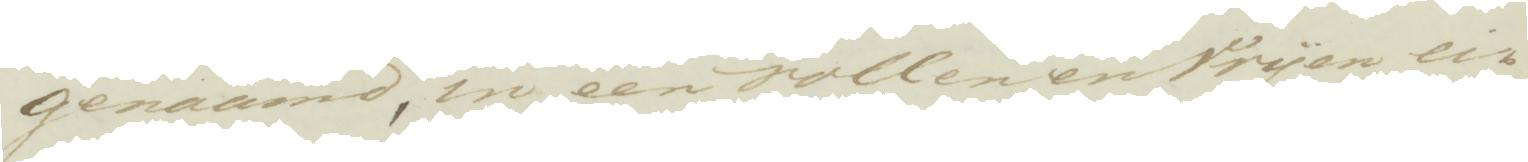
genaamd, in een vollen en vrijen ei
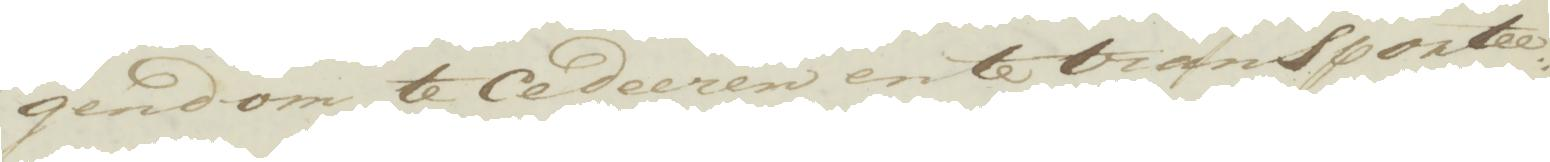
gendom te cedeeren en te transportee„
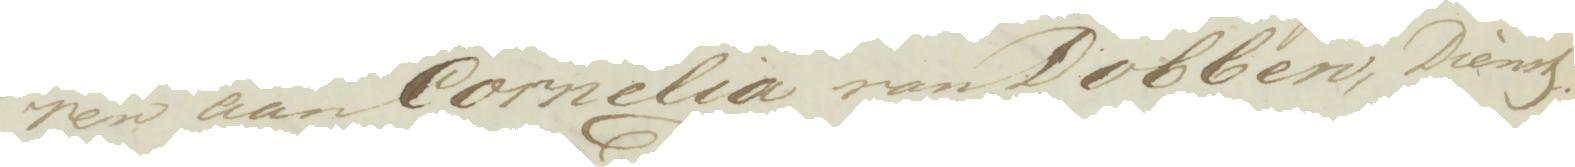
ren aan Cornelia van Dobben, dienst„
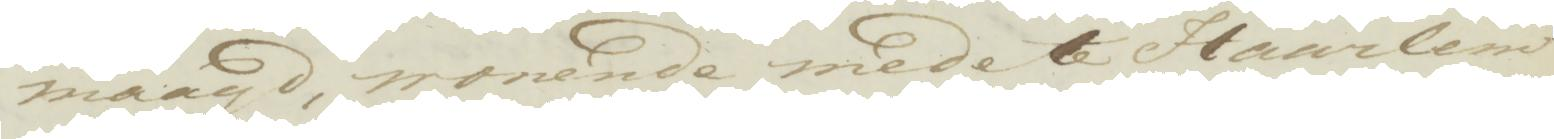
maagd, wonende mede te Haarlem
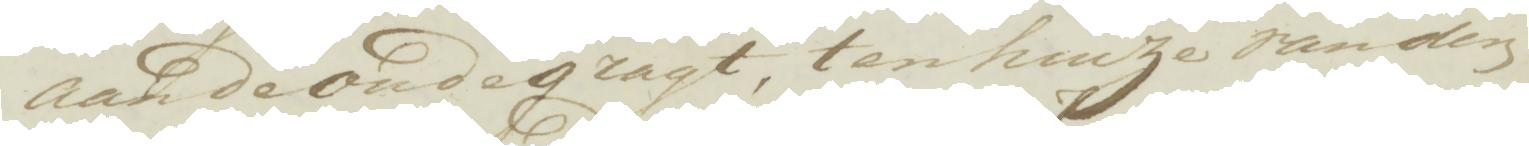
aan de oude gragt, ten huize van den
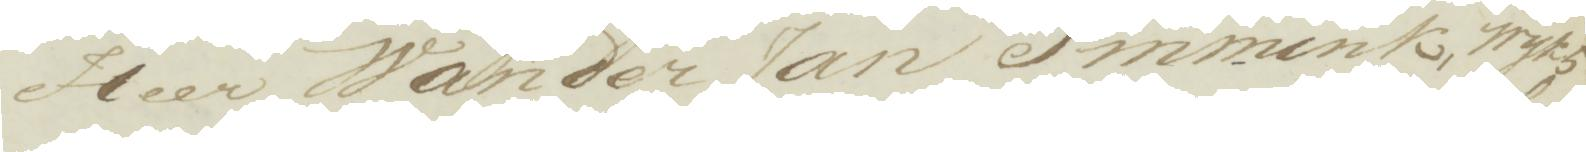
Heer Wander Jan Immink, wyk 5
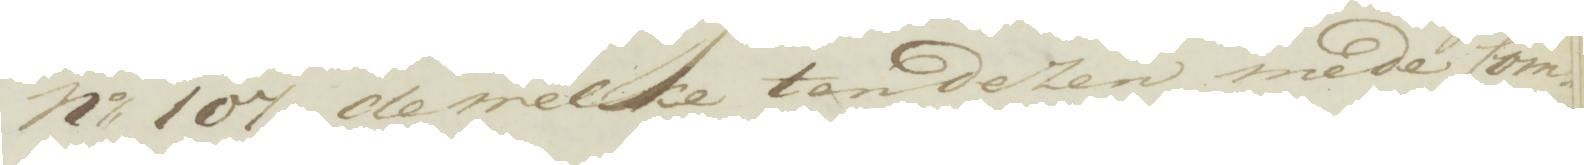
N„o 107, de welke ten dezen mede com„
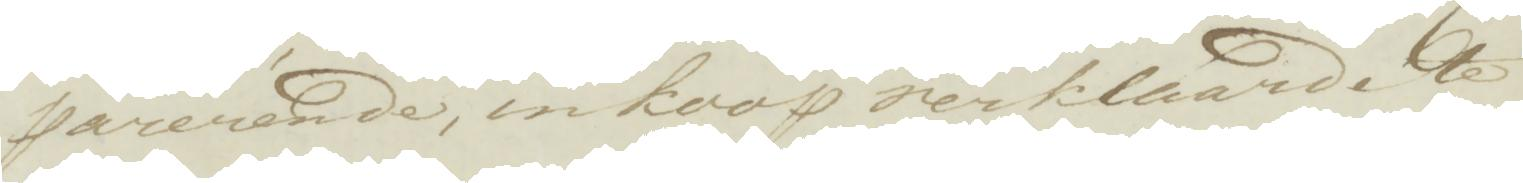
parerende, in koop verklaarde te
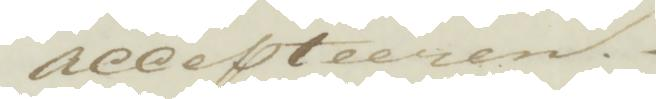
accepteeren.
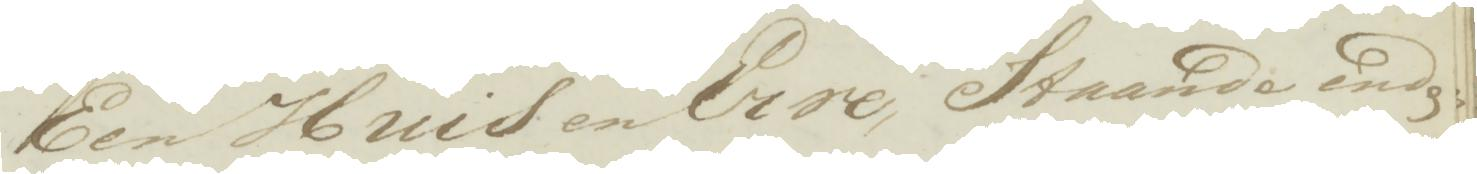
Een Huis en Erve, Staande ende
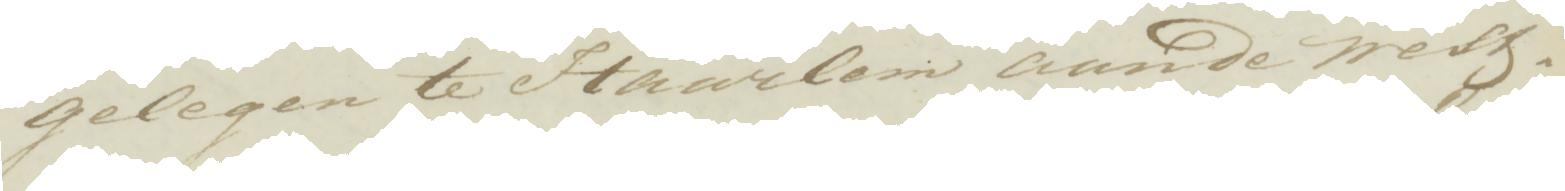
gelegen te Haarlem aan de west„
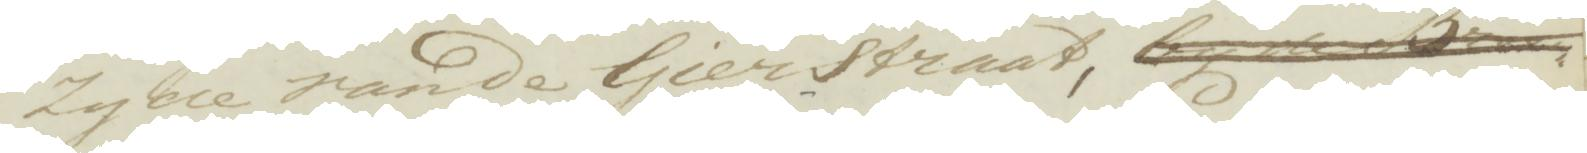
Zyde van de Gierstraat, by de Bree„
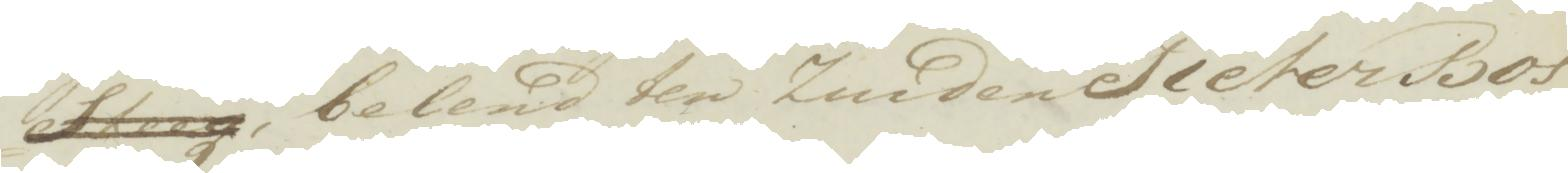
Steeg, belend ten zuiden Pieter Bos,
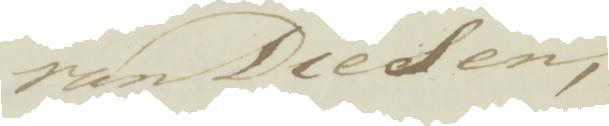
van Diesen,
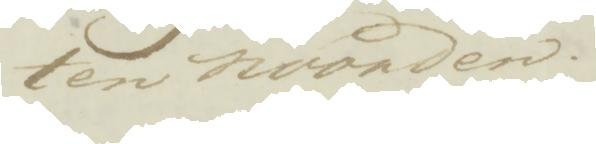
ten noorden
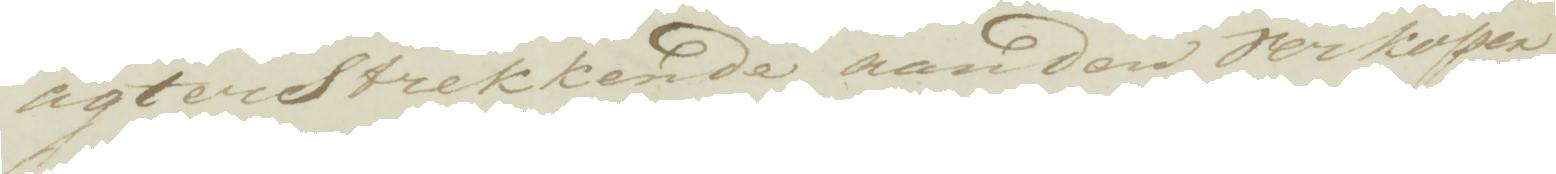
agterstrekkende aan den verkoper,
